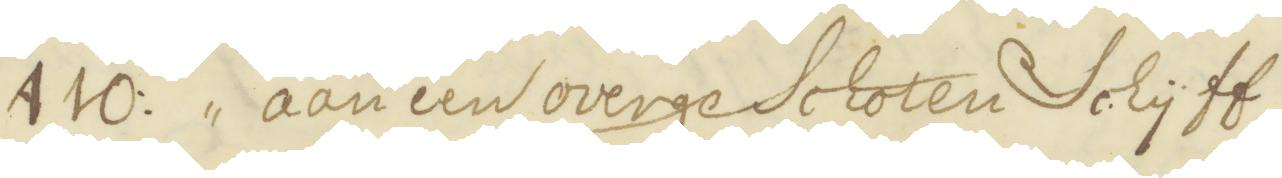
110: „ aan een overgeschoten Schijff
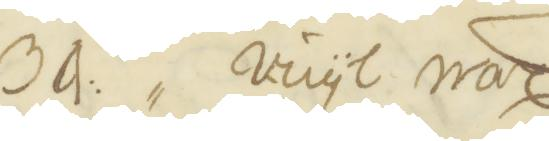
34: „ vuijl wax
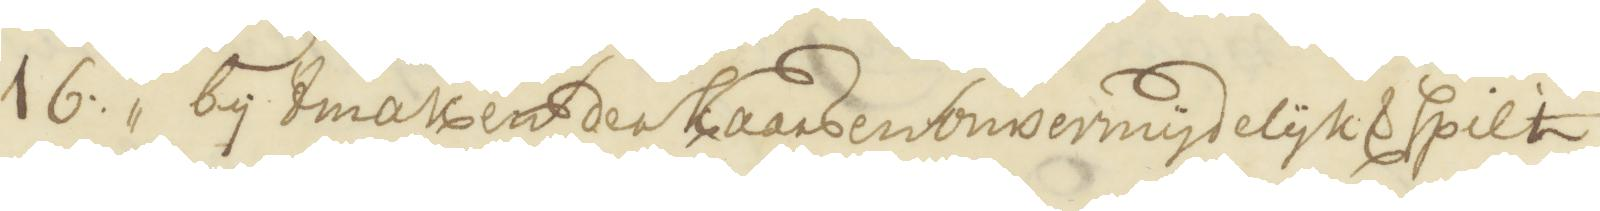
16: „ bij 'tmaken der kaarsen onvermijdelijk verspilt
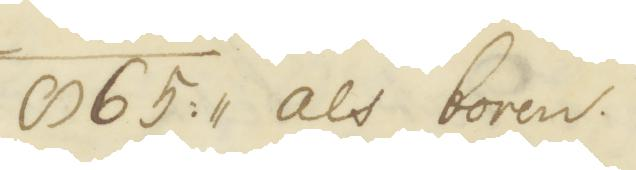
865: „ als boven.
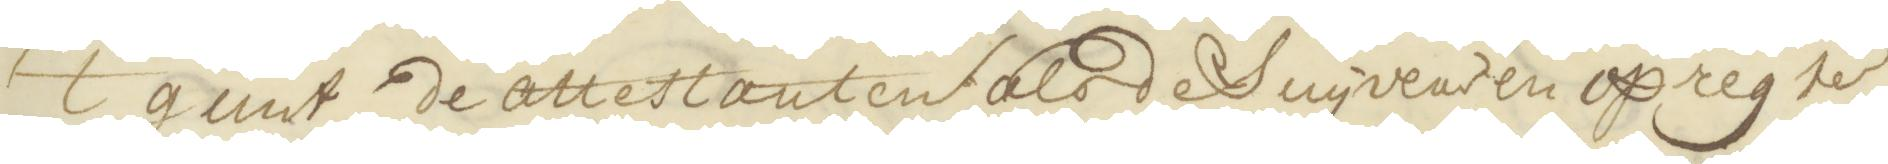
't gunt de attestanten als de suijvere en opregte
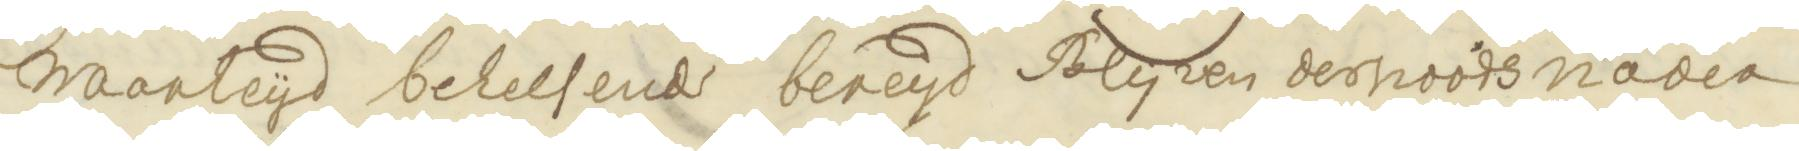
waarheijd behelsende bereyd Blijven desnoods nader
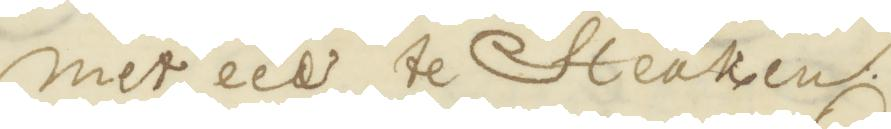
met eed te sterken.
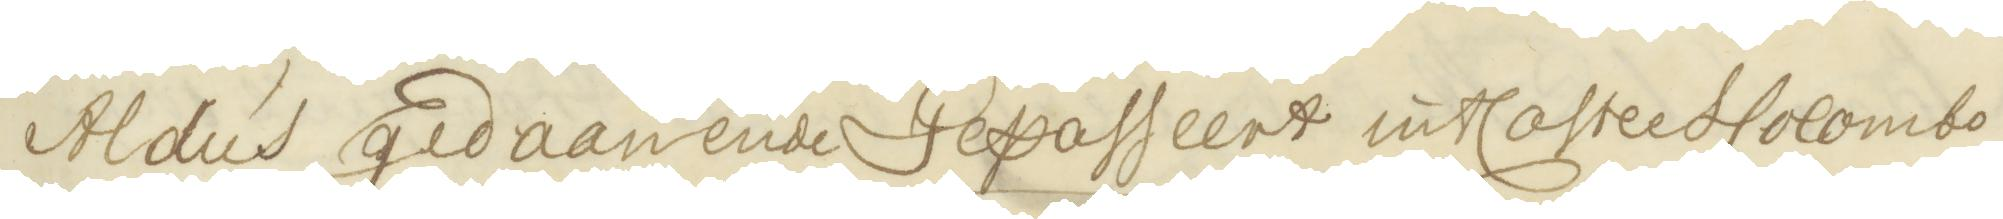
Aldus gedaan ende Gepasseert in't Casteel Colombo
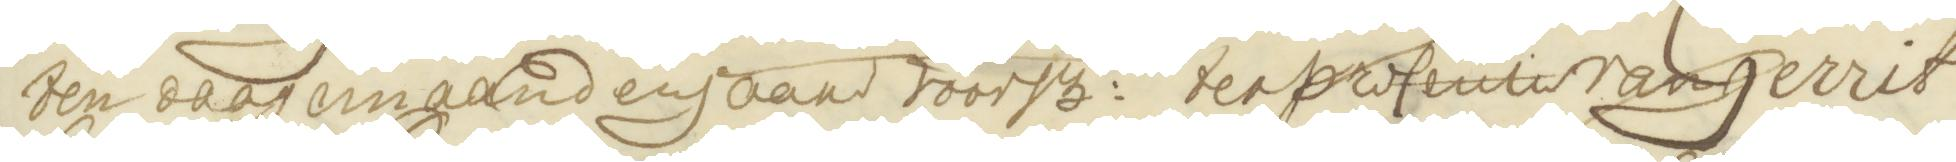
den daagemaand en jaar voorsz: ter presente van gerrit
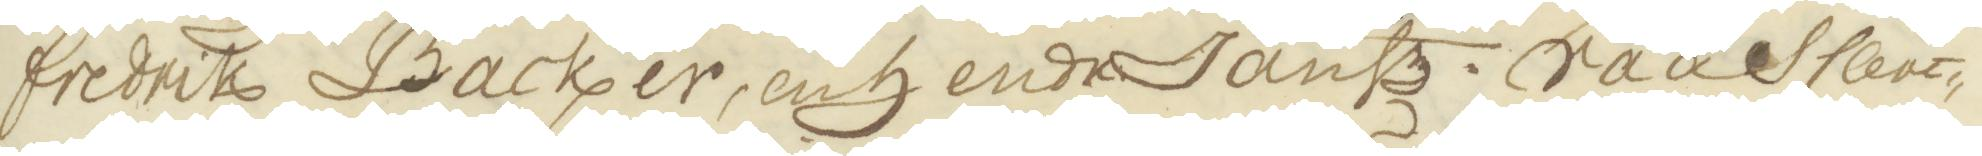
fredrik Backer, en hendk: Iansz: vaas clerc„
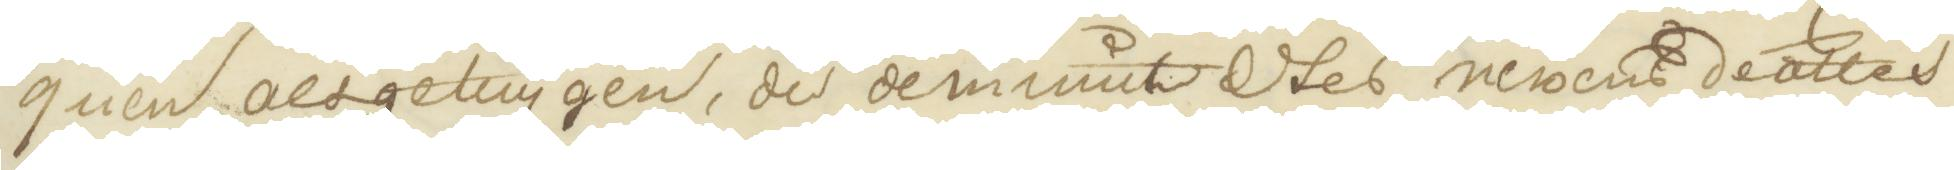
quen als getuijgen, des de minute deses nevens de attes
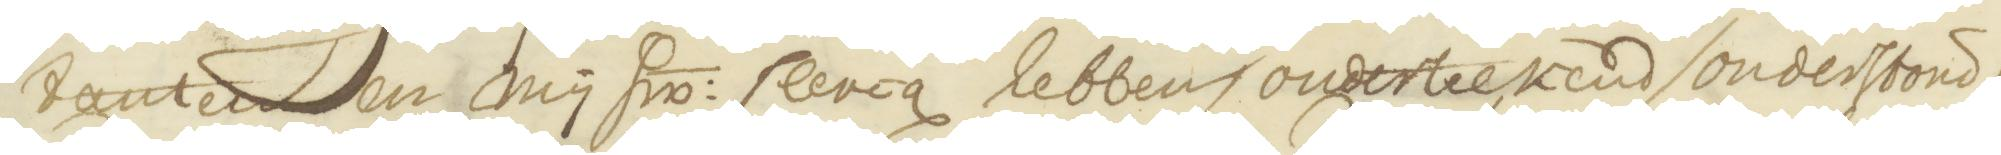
tanten en mij sw: Clercq hebben onderteekend / onderstond
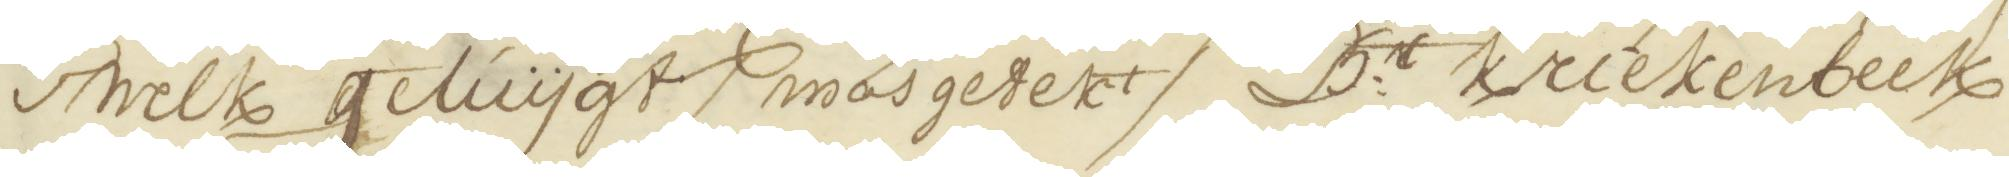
twelk getuijgt / was getekt / B:t kriekenbeek
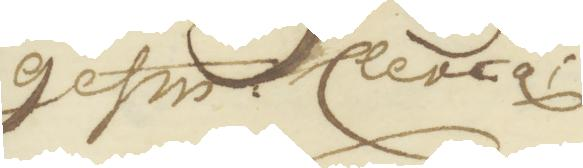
gesw: Clercq:
